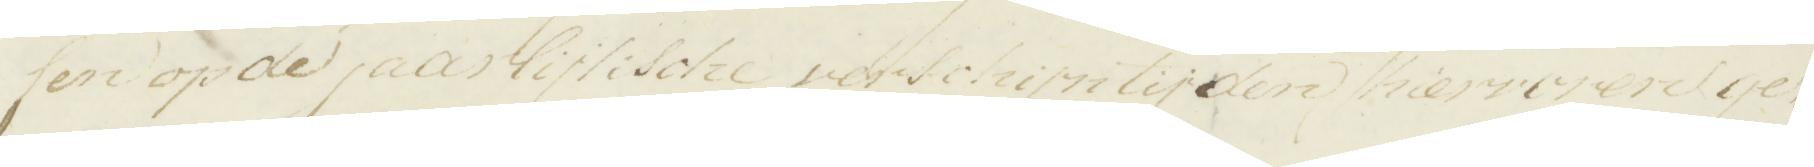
sen op de jaarlijksche verschijntijden hiervoren ge
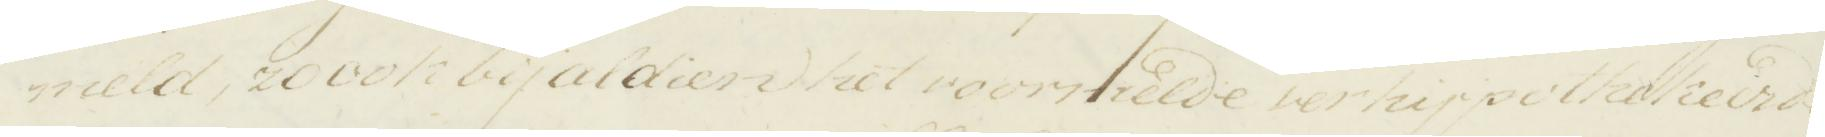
meld, zo ook bij aldien het voormelde verhijpothekeerde
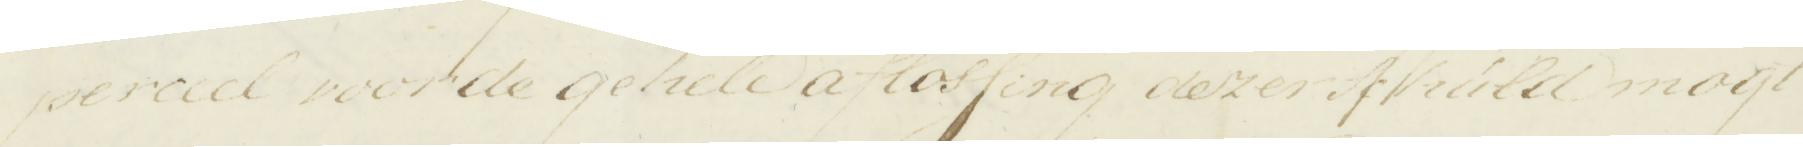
perceel voor de gehele aflossing dezer schuld mogt
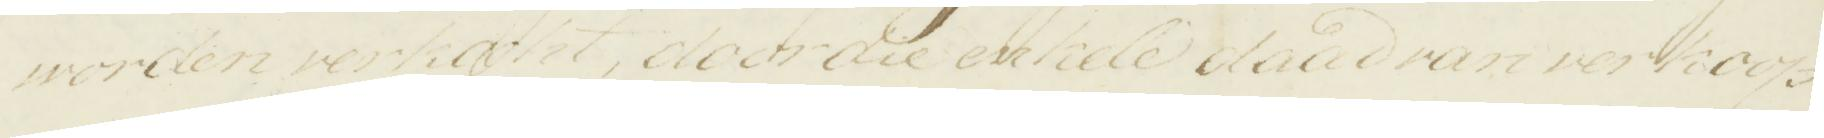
worden verkocht, door die enkele daad van verkoop
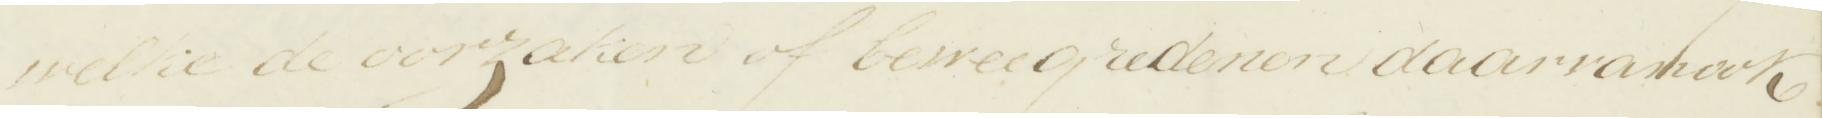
welke de oorzaken of beweegredenen daarvan ook
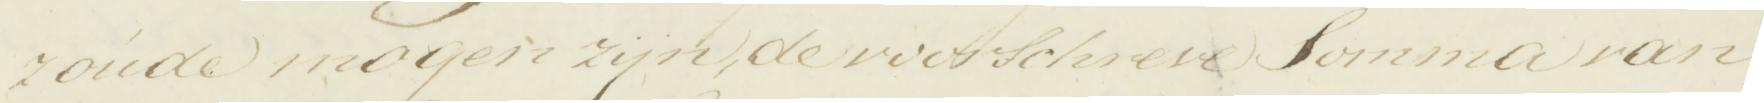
zoude mogen zijn, de voorschreve Somma van
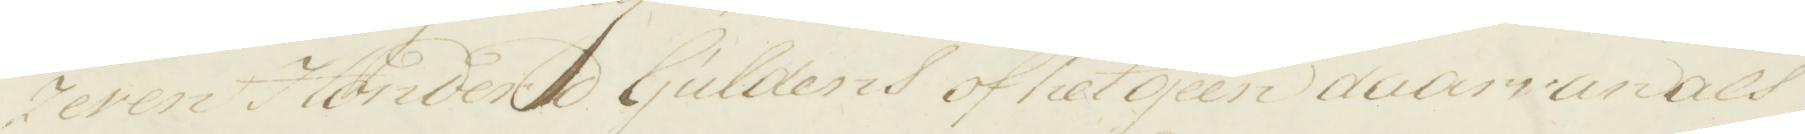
zeven Honderd Guldens of hetgeen daarvan als
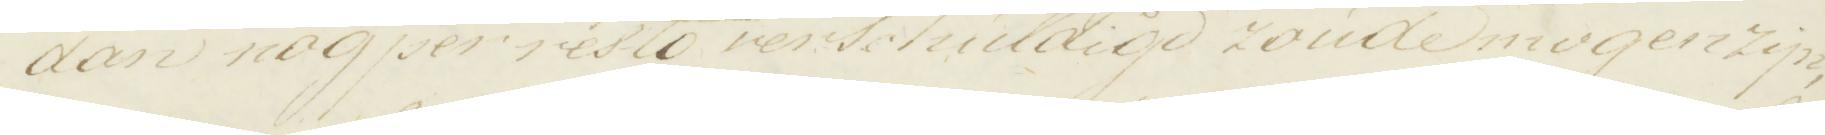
dan nog per resto verschuldigd zoude mogen zijn,
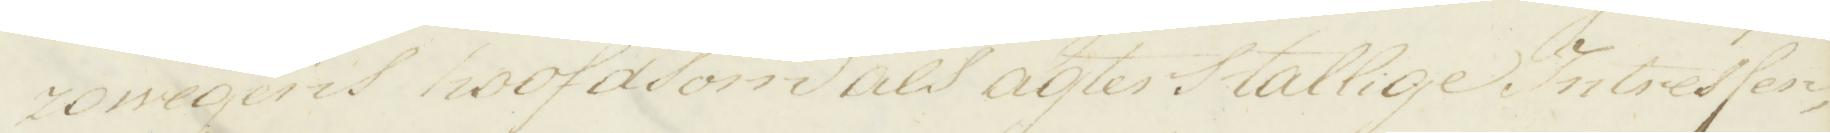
zo wegens hoofdsom als agterstallige Jntressen,
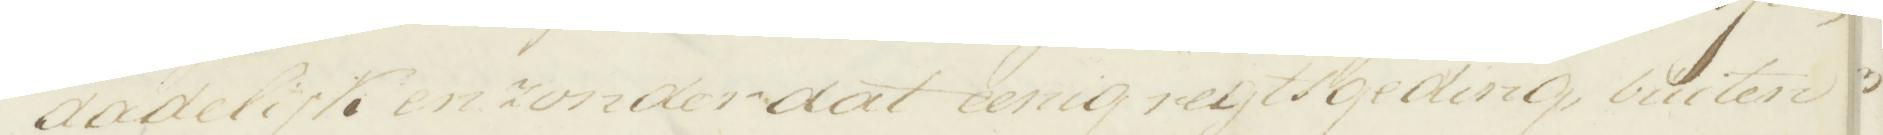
dadelyk en zonder dat eenig regtsgeding, buiten
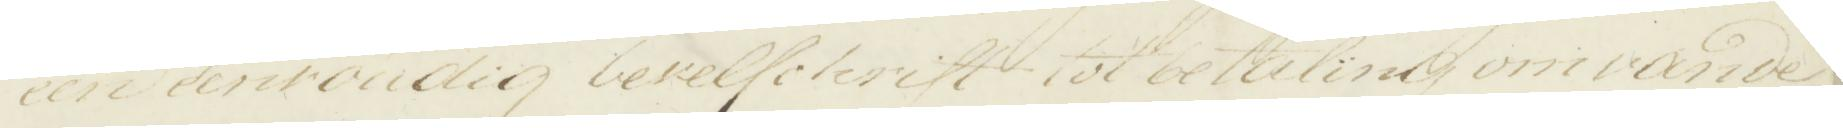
een eenvoudig bevelschrift tot betaling om van de
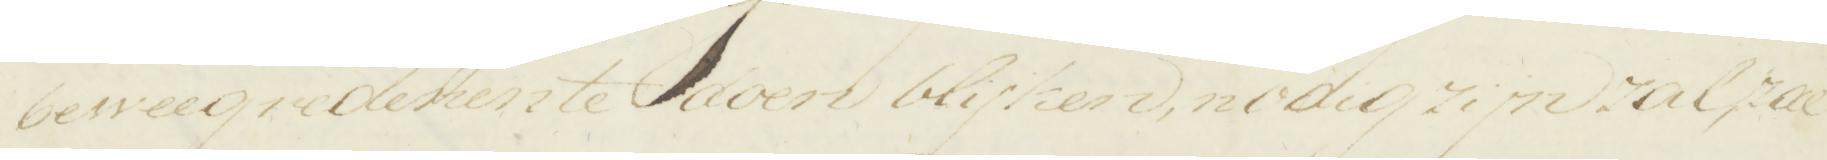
beweegredenen te doen blijken, nodig zijn zal, zal
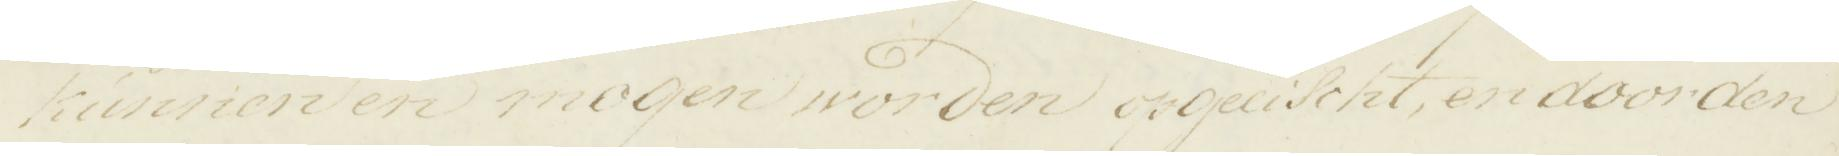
kunnen en mogen worden opgeeischt, en door den
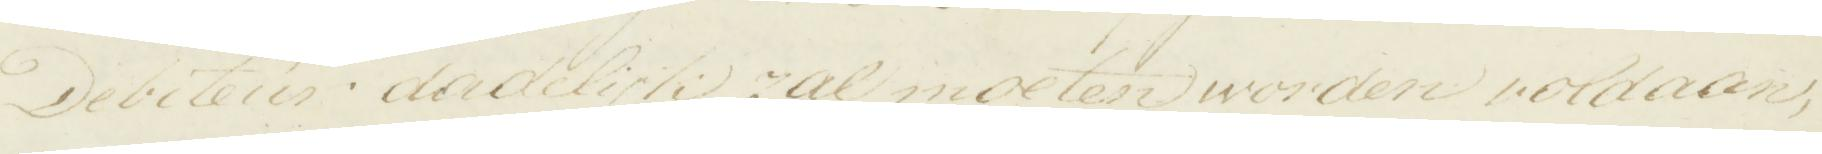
Debiteur dadelijk zal moeten worden voldaan,
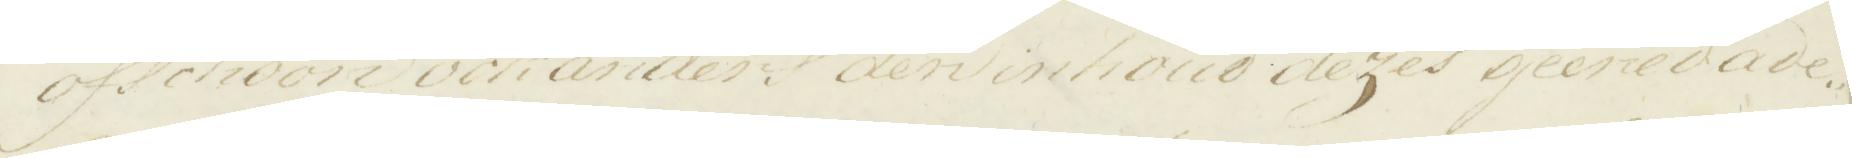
ofschoon ook anders den inhoud dezes geene dade„
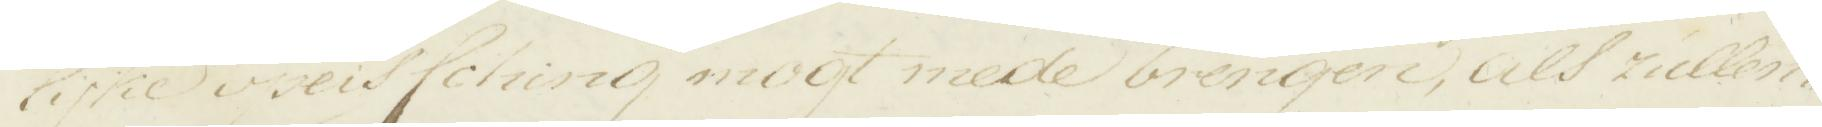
lijke opeissching mogt mede brengen, als zullen„
